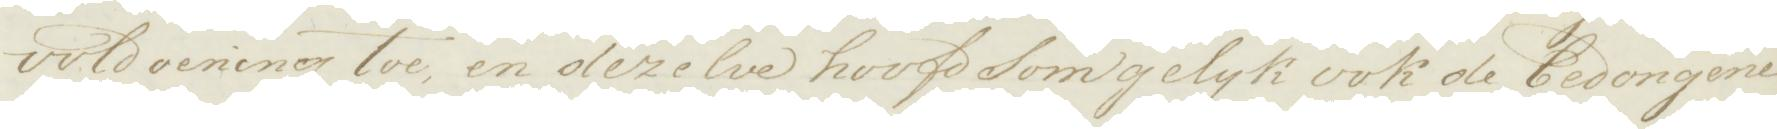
voldoening toe, en dezelve hoofd som gelyk ook de bedongene
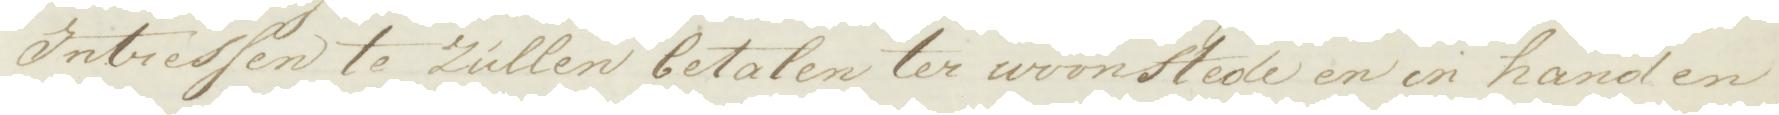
Intressen te zullen betalen ter woonstede en in handen
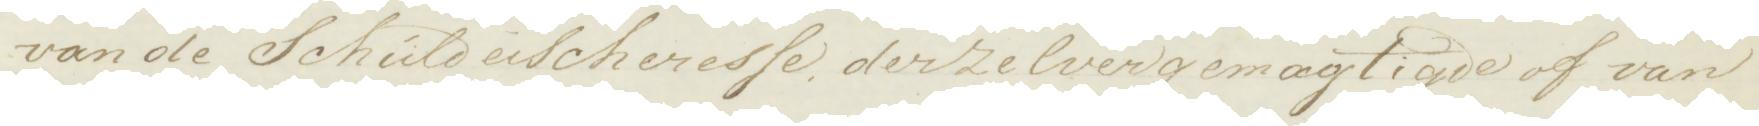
van de Schuldeischeresse, derzelver gemagtigde of van
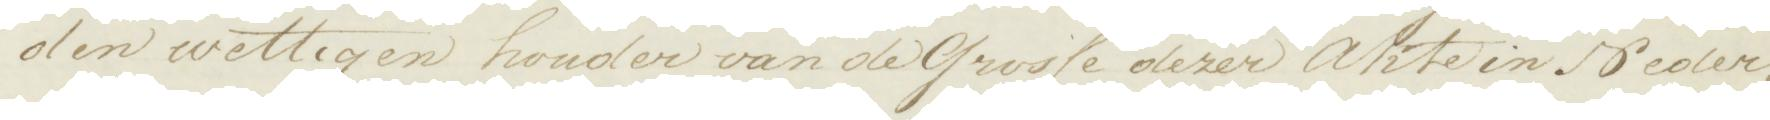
den wettigen houder van de Grosse dezer Akte in Neder
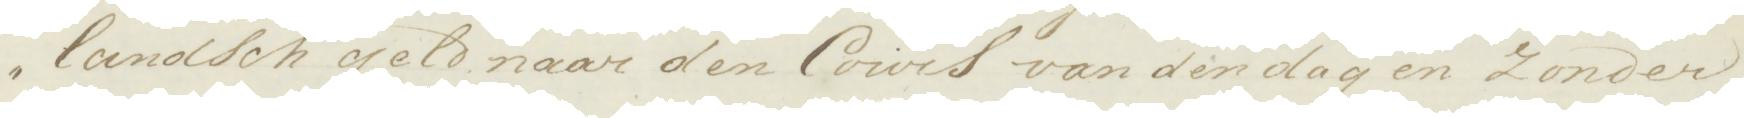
„landsch geld naar den Cours van den dag en zonder
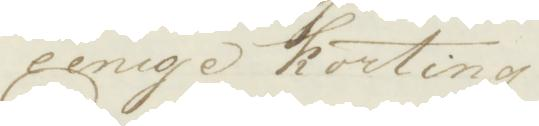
eenige korting
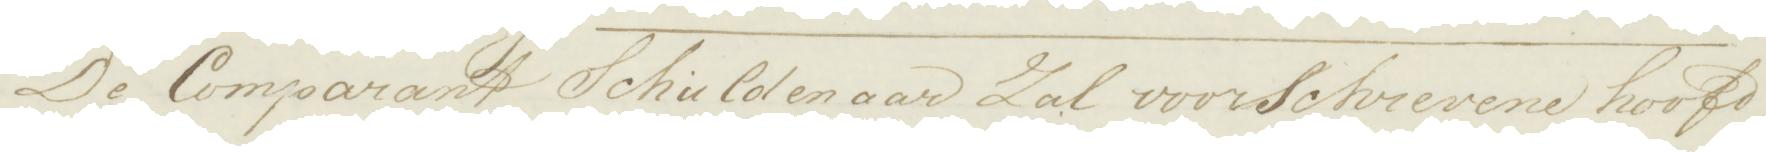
De Comparant schuldenaar zal voorschrevene hoofd
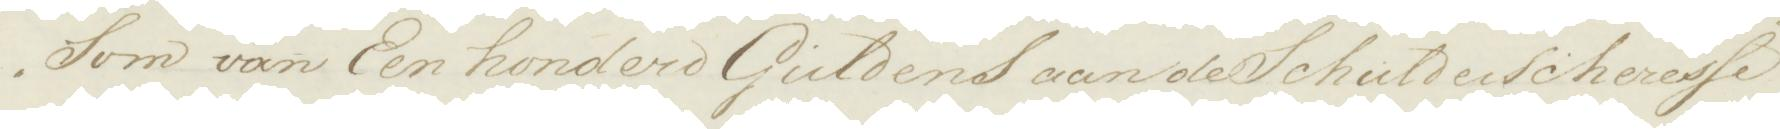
„Som van Een honderd Guldens aan de Schuldeischeresse
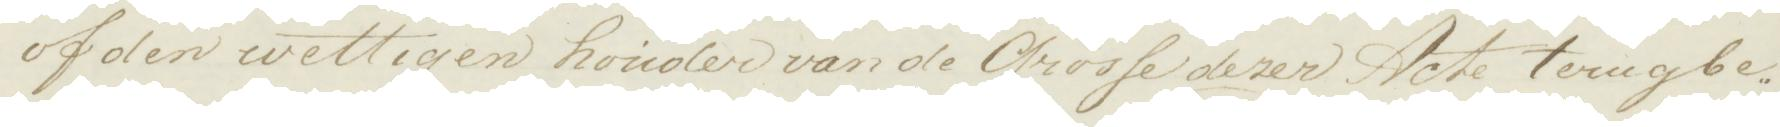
of den wettigen houder van de Grosse dezer Acte terugbe„
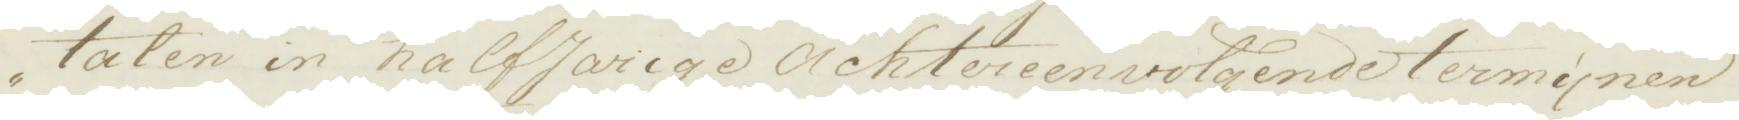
„talen in halfjarige achtereenvolgende termijnen
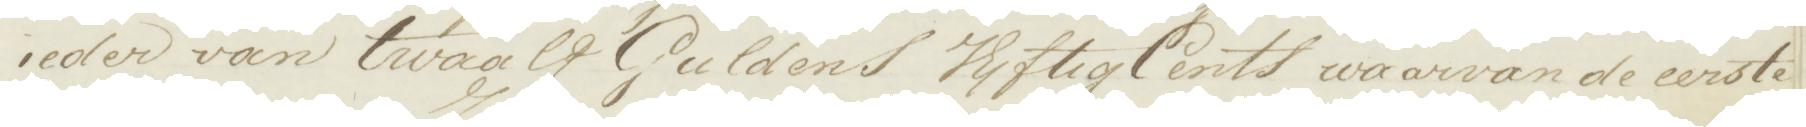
ieder van twaalf Guldens Vyftig Cents waarvan de eerste
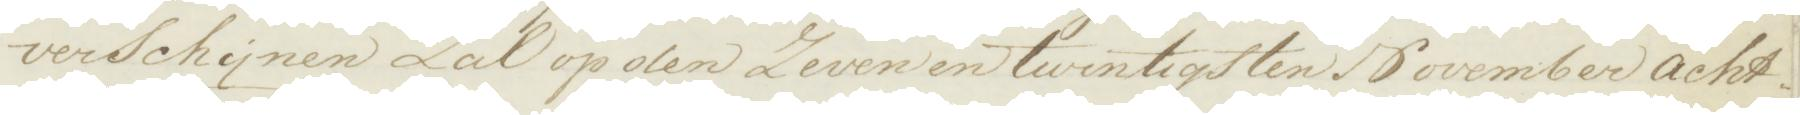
verschijnen zal op den Zeven en twintigsten November acht„
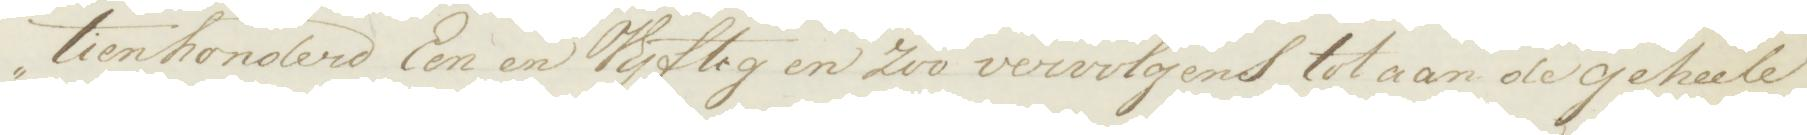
„tienhonderd Een en Vyftig en zoo vervolgens tot aan de geheele
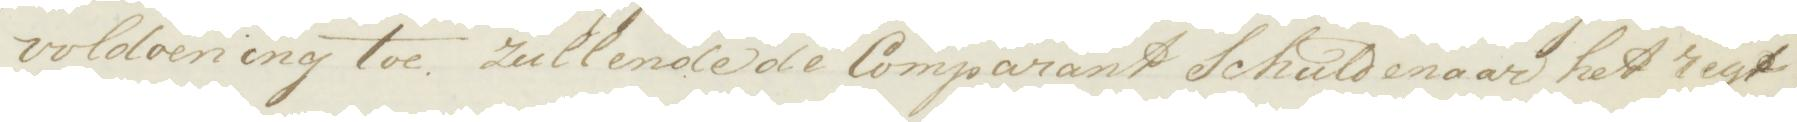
voldoening toe zullende de Comparant schuldenaar het regt
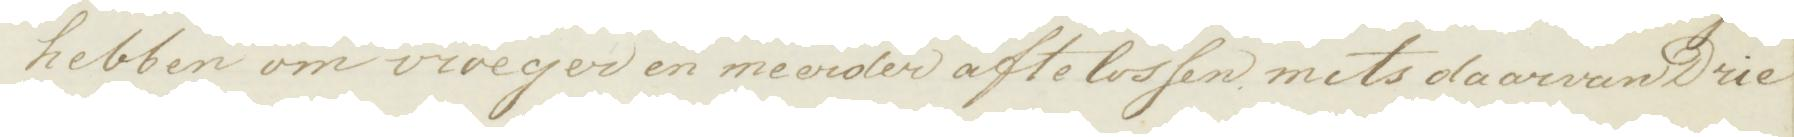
hebben om vroeger en meerder afte lossen, mits daarvan Drie
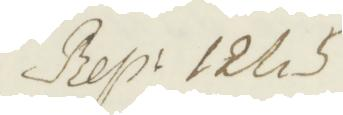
Rep: 1245
